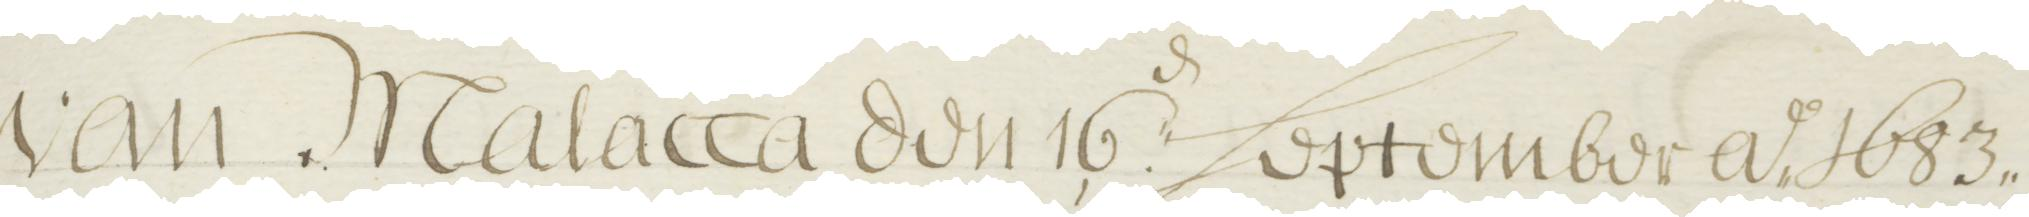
van Malacca den 16:e September a„o 1683„
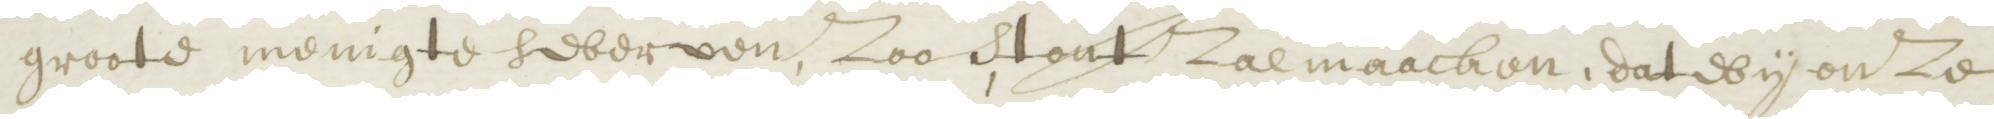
groote menigte swerven, zoo stout zal maacken, dat wij onze
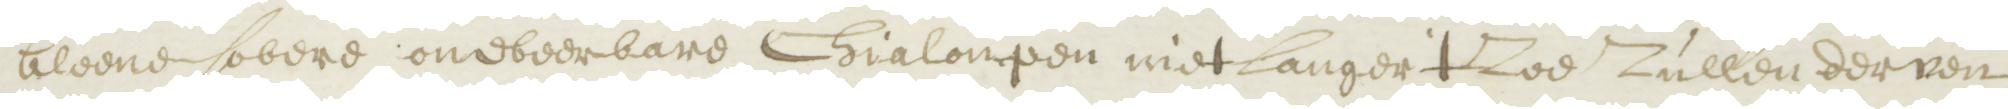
kleene sobere onweerbare Chialoupen niet langer 't zee zullen derven
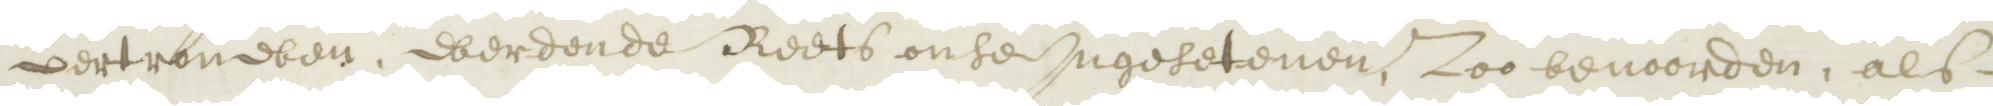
vertrouwen, werdende Reets onse Jngesetenen, zoo benoorden, als —
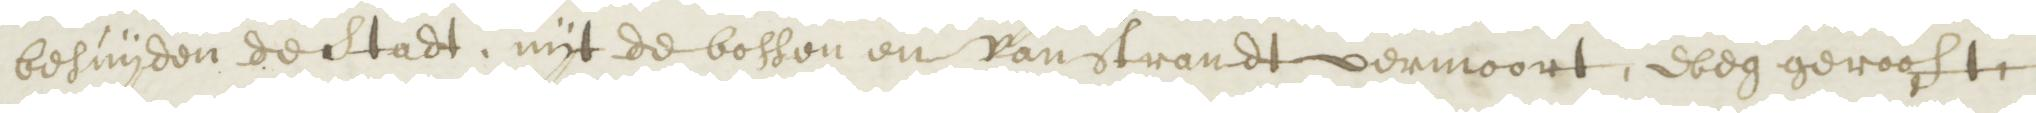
besuijden de stadt, uijt de bossen en van strandt vermoort, weg gerooft,
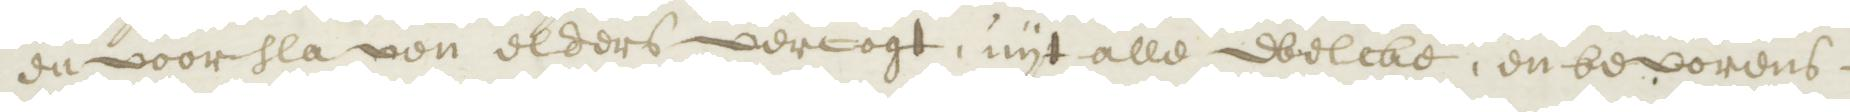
en voor slaven elders vercogt, uijt alle welcke, en bevorens
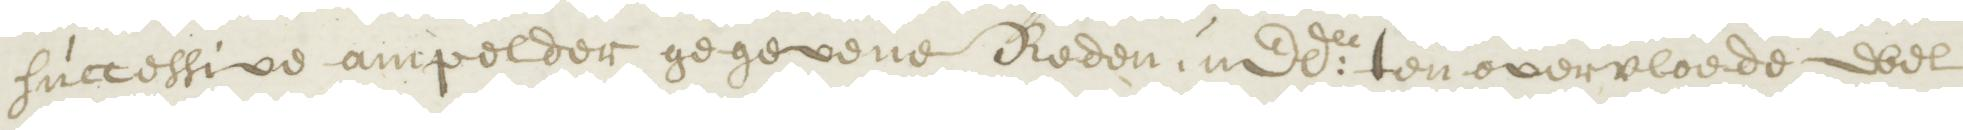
successive ampelder gegevene Reden, u Ed:e ten overvloede, wel
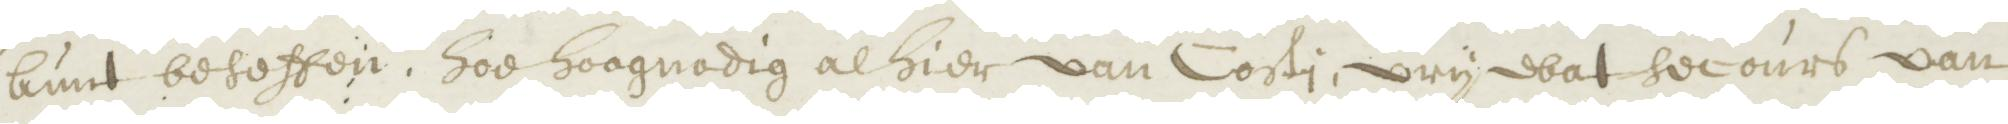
kunt beseffen, hoe hoognodig alhier van Coslij, vrij wat secours van
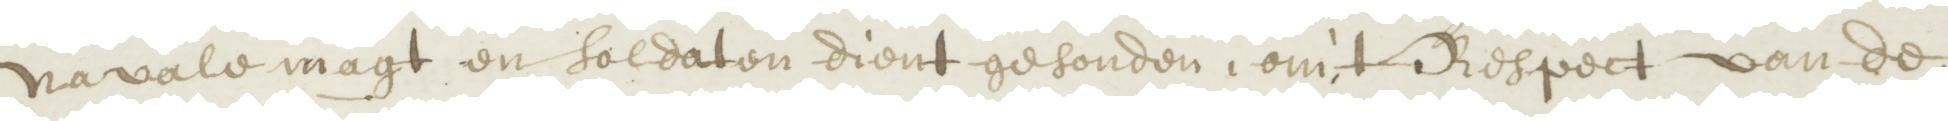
navale magt en soldaten dient gesonden, om ’t Respect van de
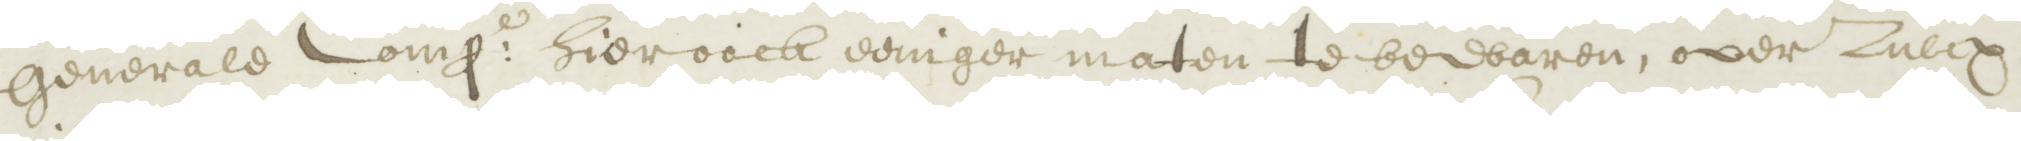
generale Comp:e hier oock eeniger maten te bewaren, over zulcx
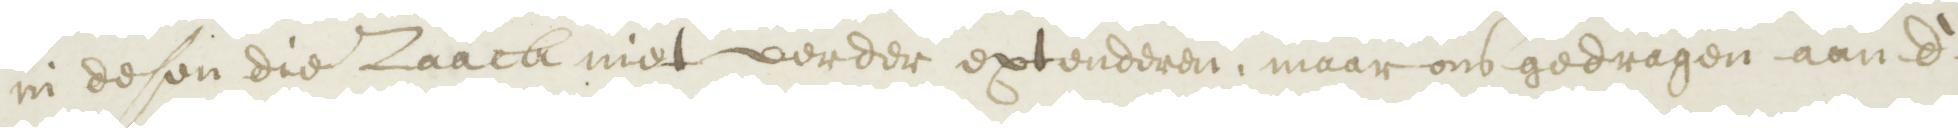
in desen die zaack niet verder extenderen, maar ons gedragen aan d
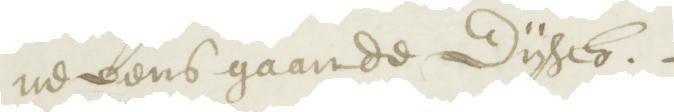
nevens gaande Eijsch. —
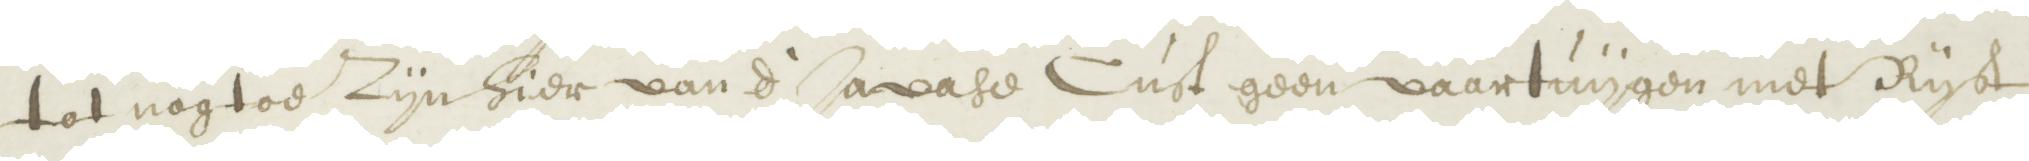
tot nog toe zijn hier van d’ Javase Cust geen vaartuijgen met Rijst
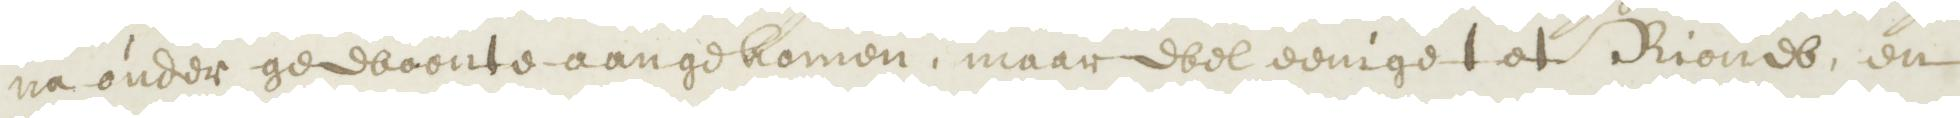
na ouder gewoonte aangekomen, maar wel eenige tot Riouw, en
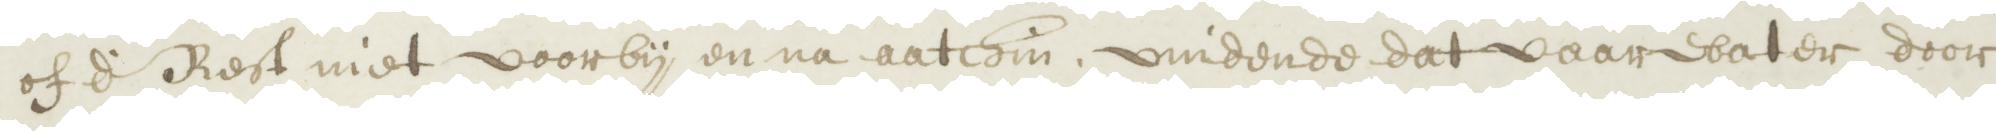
of d' Rest niet voorbij en na aatchin. vindende dat vaarwater door
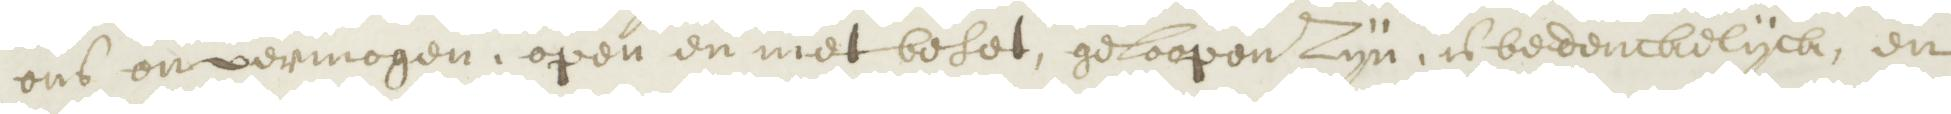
ons onvermogen, open en niet beset, geloopen zijn, is bedenckelijck, en
